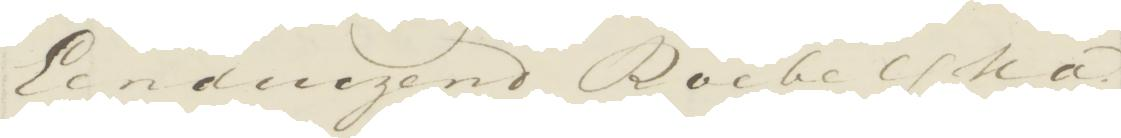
Een duizend Roebels ka
